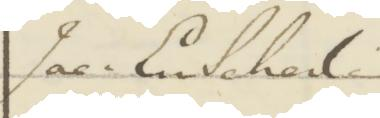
Jac. Enschedé
